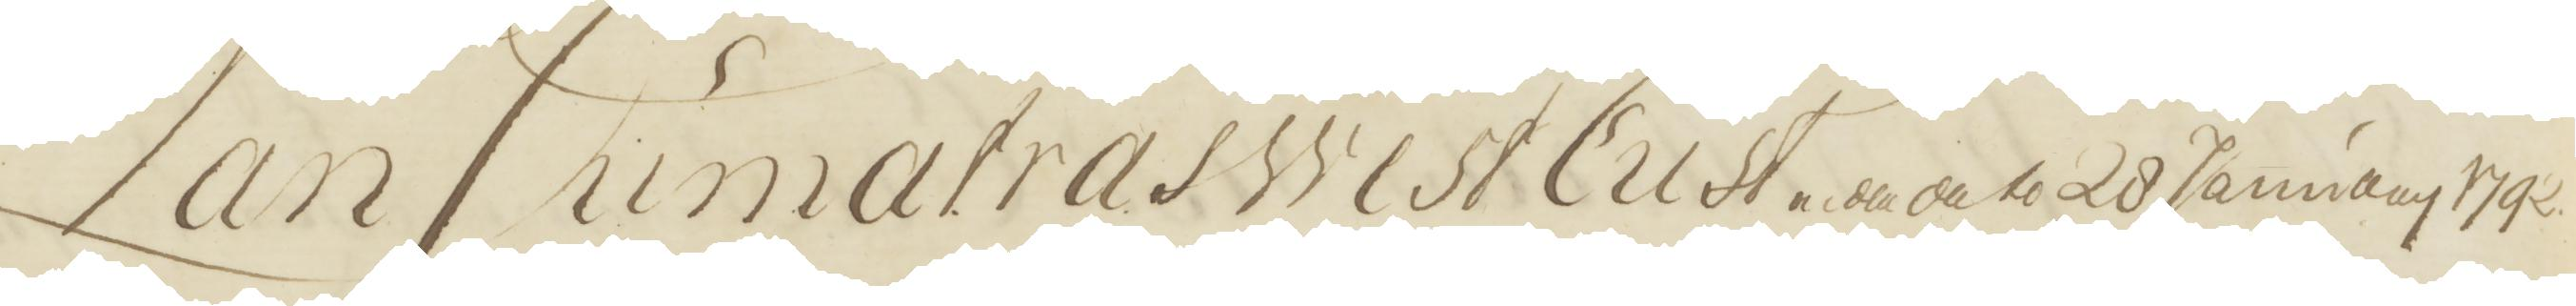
Van Sumatras West Cust onder dato 28 January 1742.
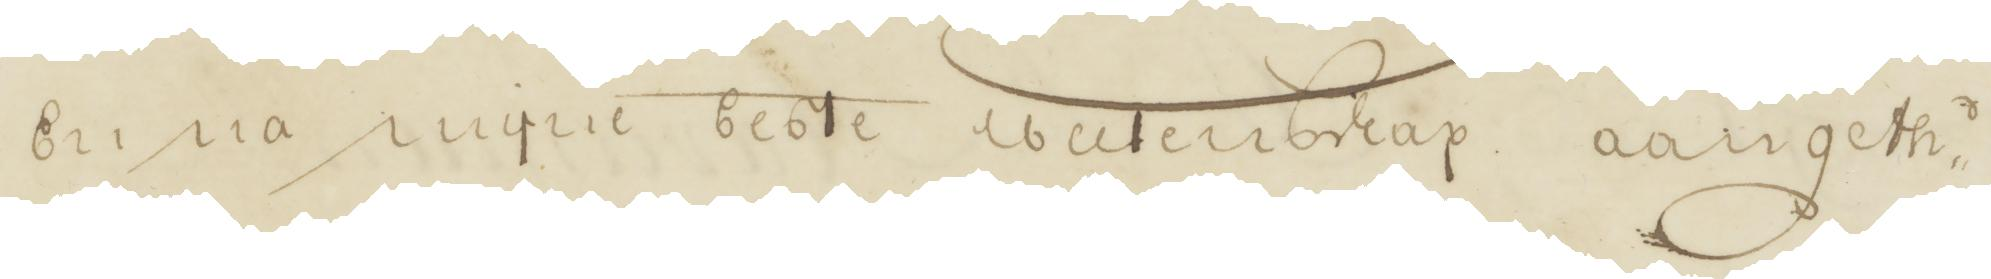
En na mijne beste weetenschap aan geth„d
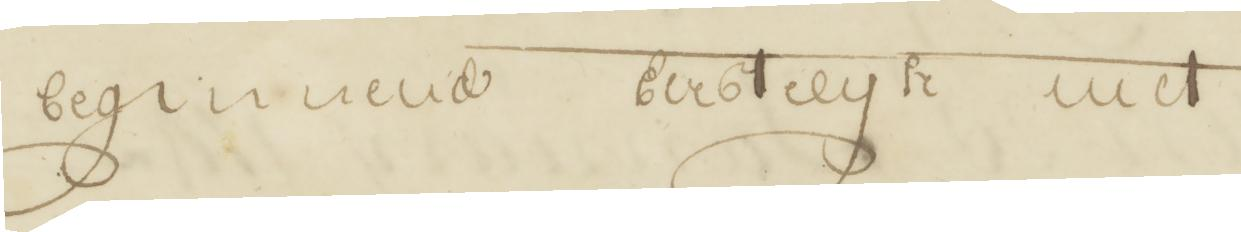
beginnend Eerstelyk met
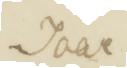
Iaar
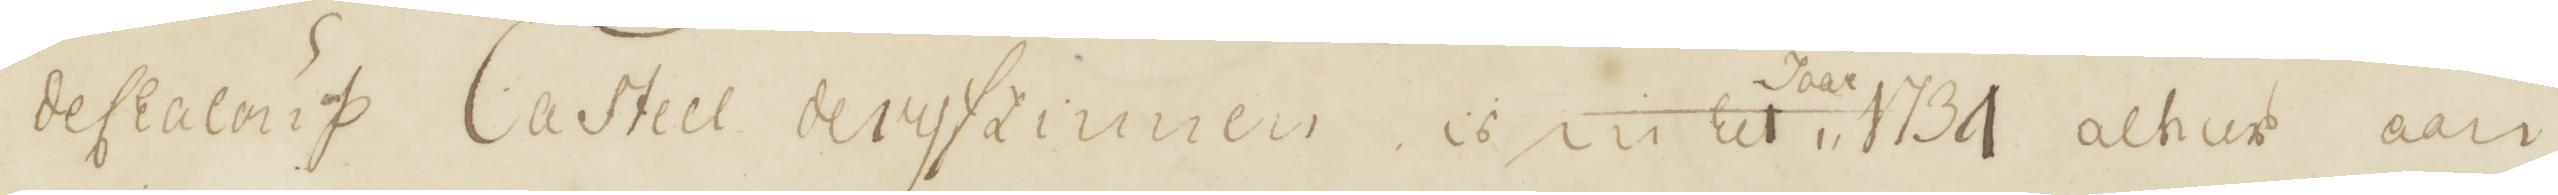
de Chaloup Casteel de vyf zinnen is in het „Jaar 1734 alhier aan
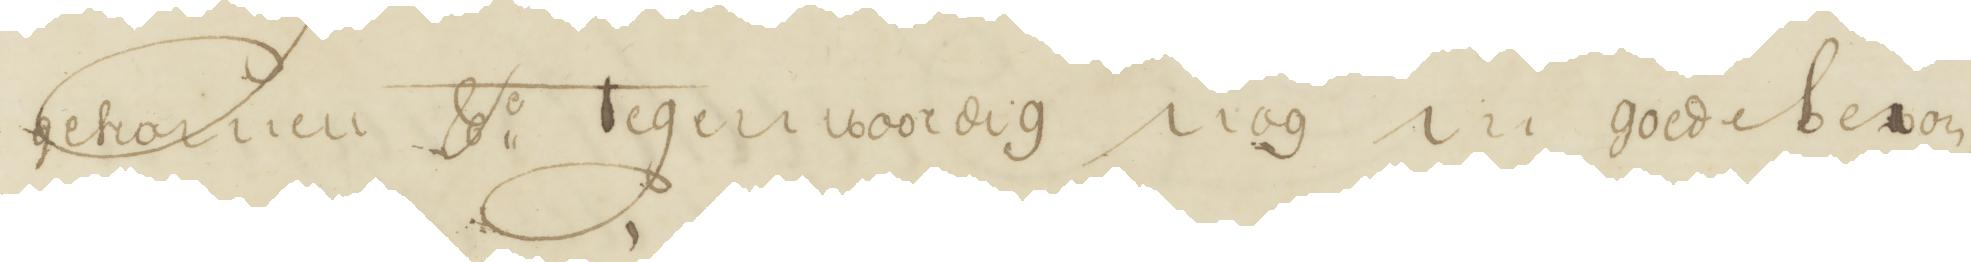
gekomen Ed„e tegenwoordig nog in goede bevon
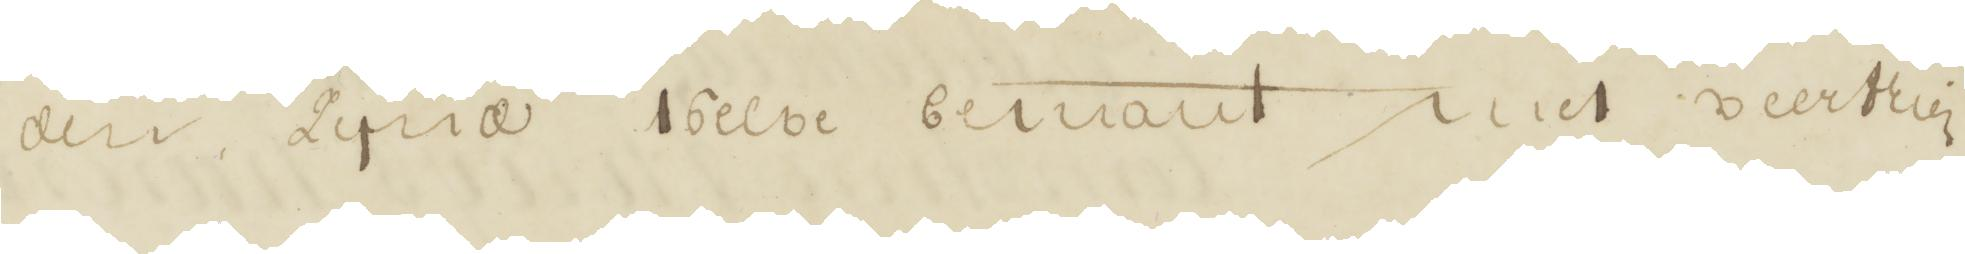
den, zynde 'tselve bemant met veerthien
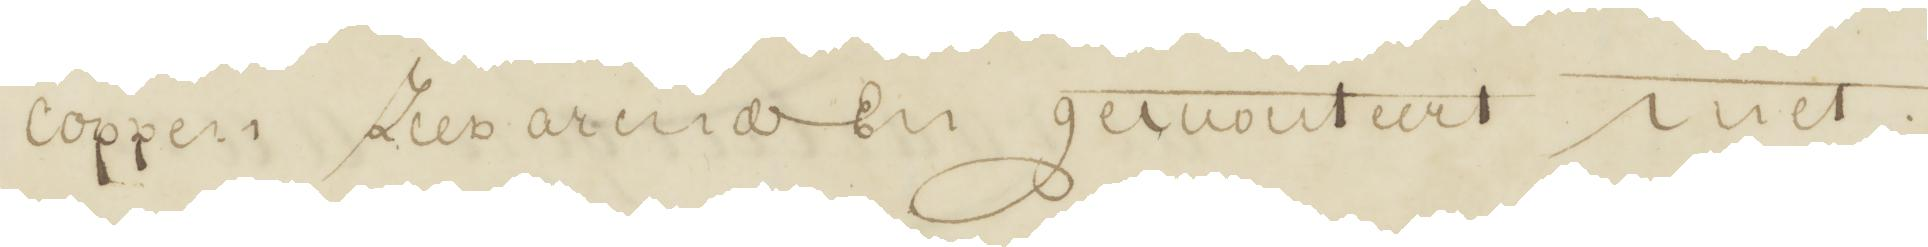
coppen zeevarende En gemonteert met.
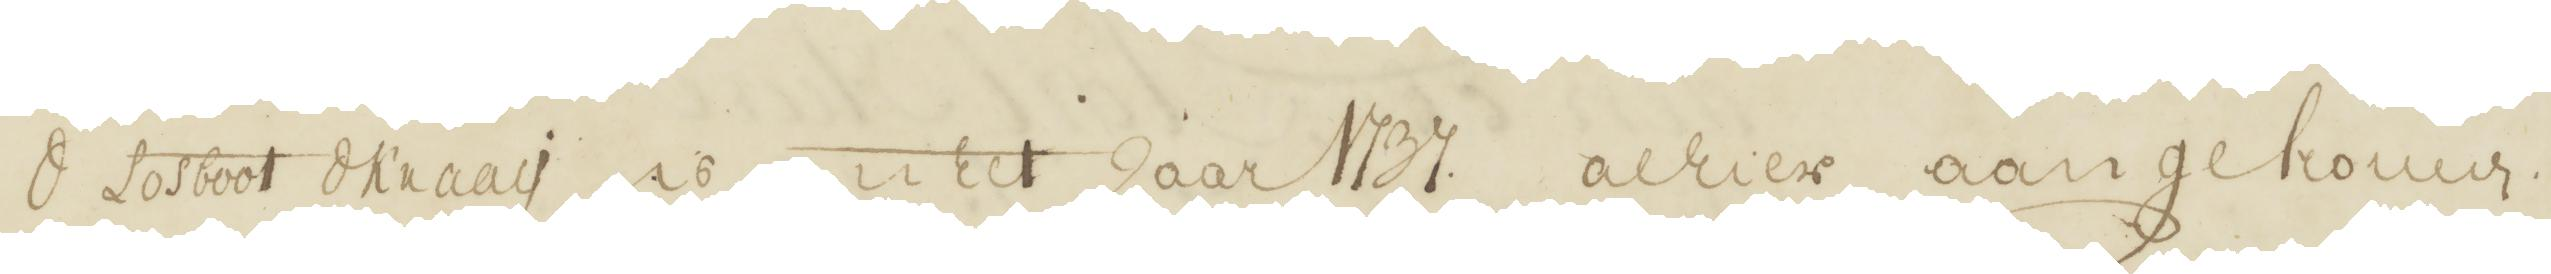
d' Losboot d kraaij is in het Jaar 1737. alhier aan gekomen.
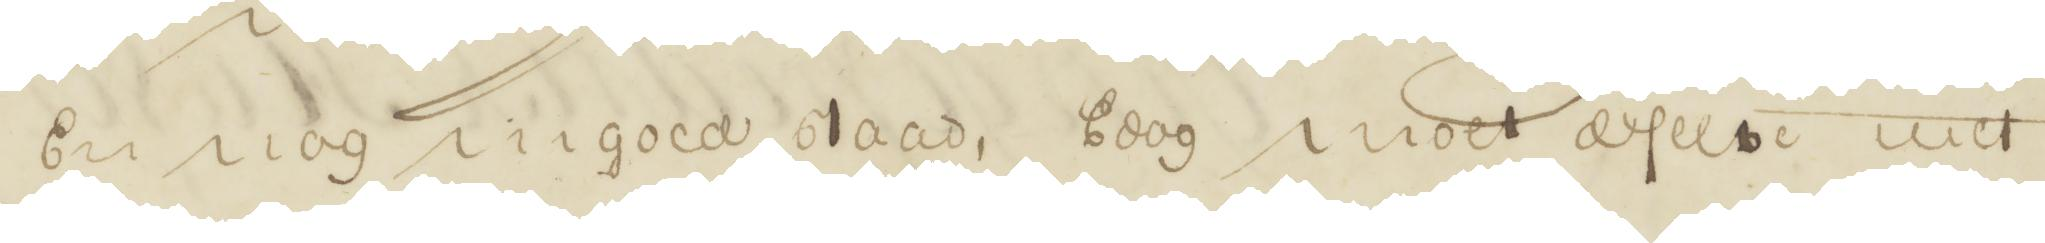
En nog in goede staad, boog moet deselve met
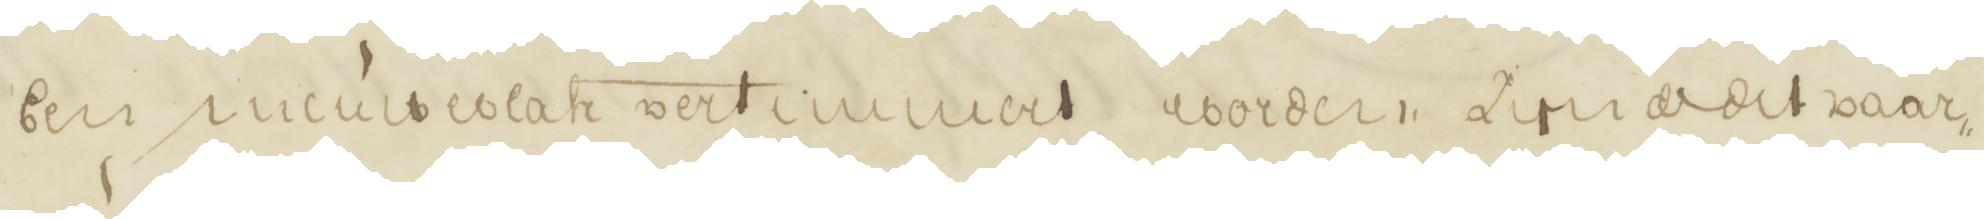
Een nieuwe vlak vertimmert worden, zyn de dit vaar„
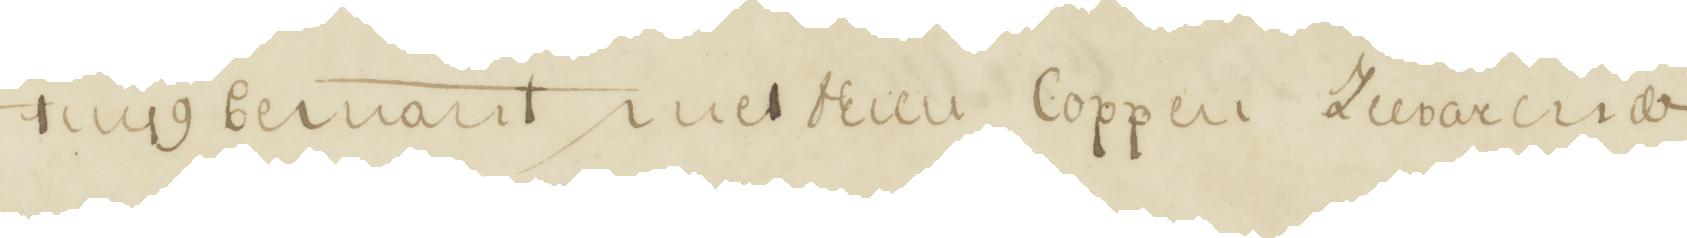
tuyg bemant met thien coppen zeevarende.
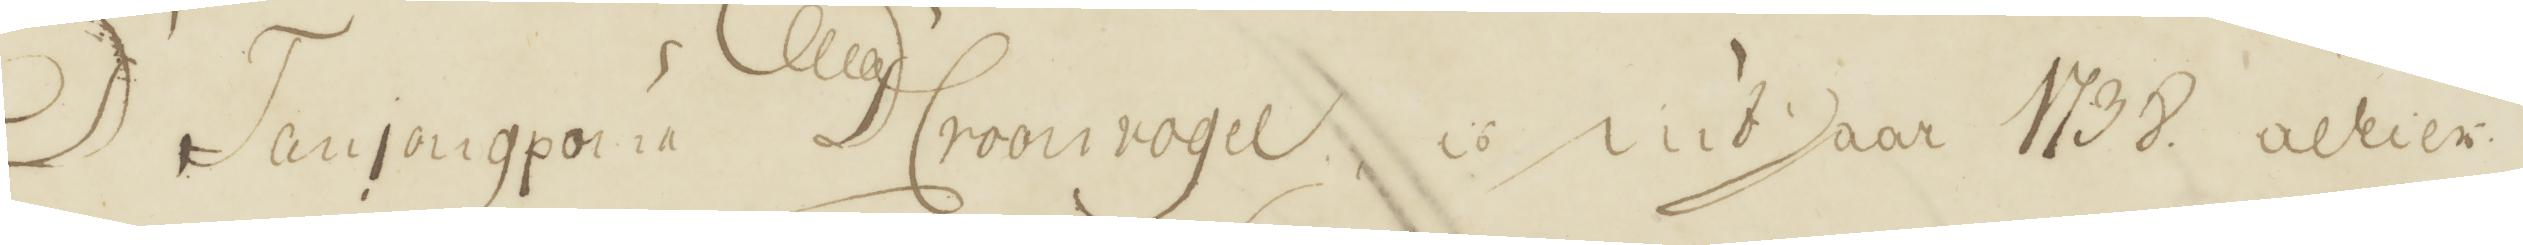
D' Tanjongpoura D' Croonvogel, is in 't Jaar 1738. alhier
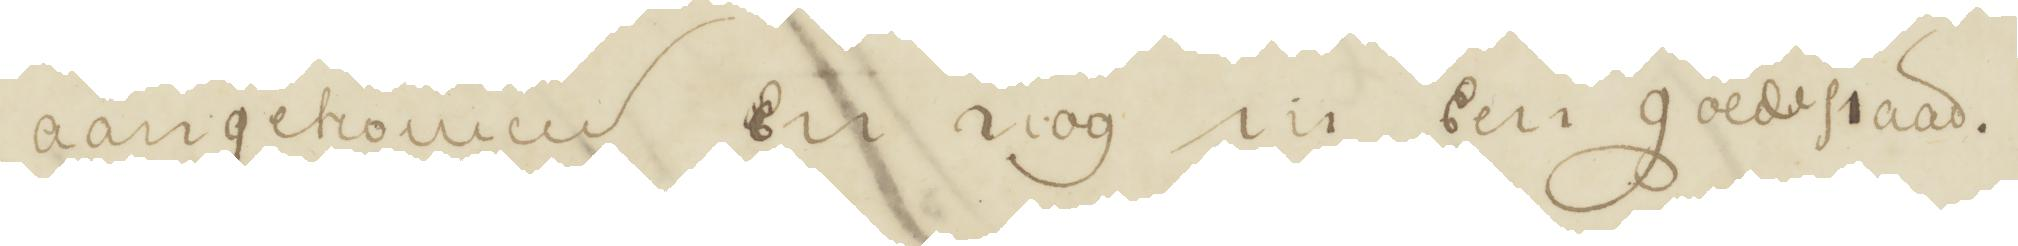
aangekomen En nog in Een goede staad.
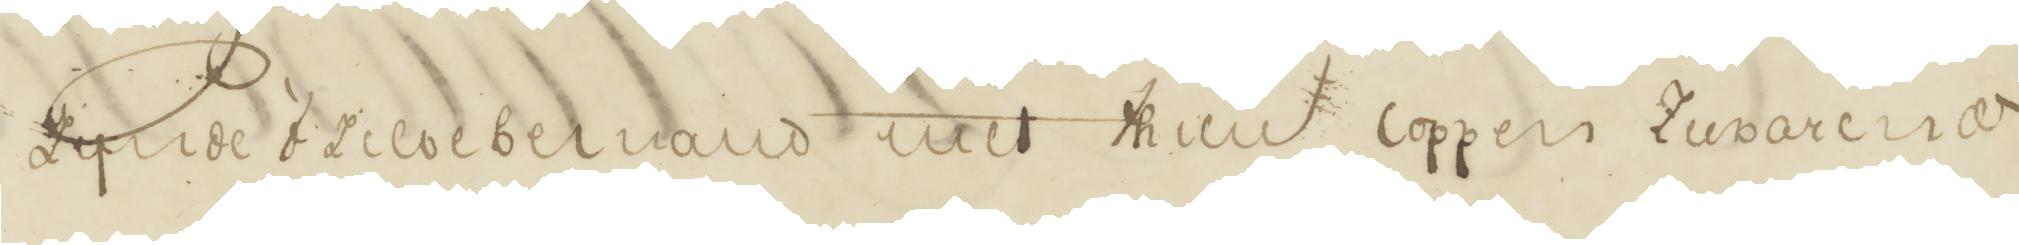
zynde 't zelve bemand met thien coppen zeevarende
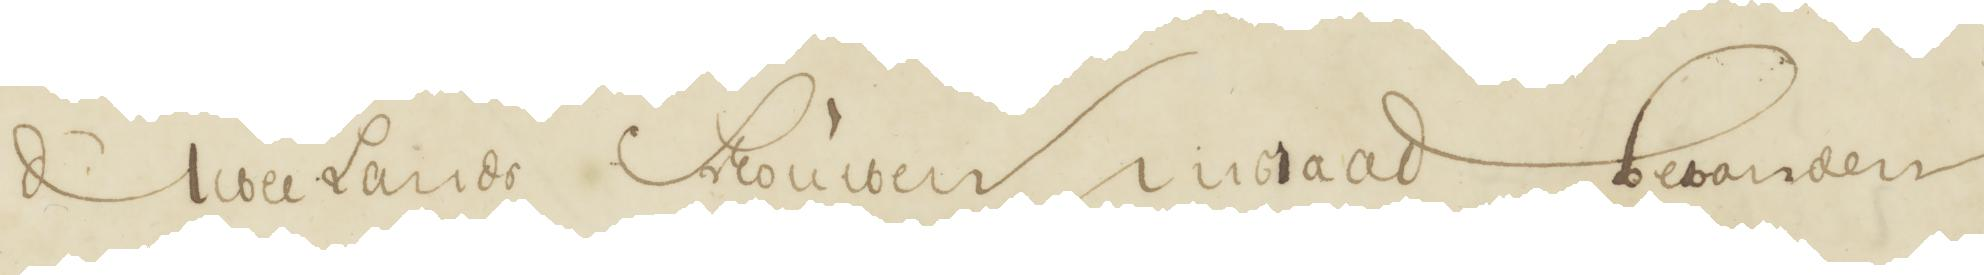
d' twee Lands schouwen in staad bevonden.
